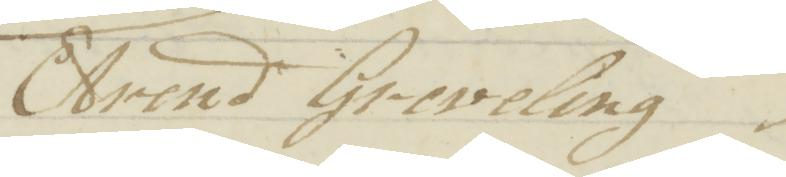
Arend Greveling
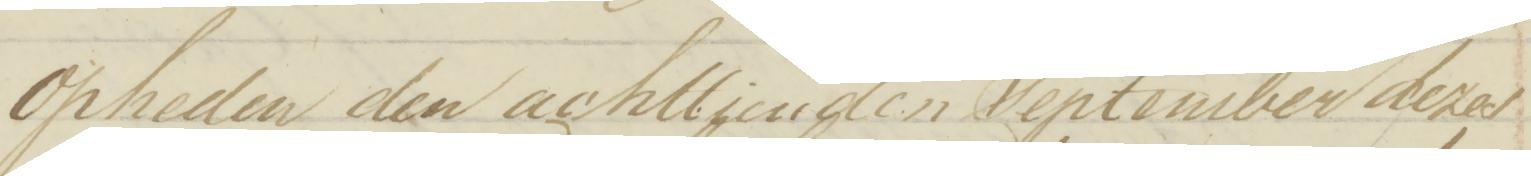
opheden den achttienden September dezes
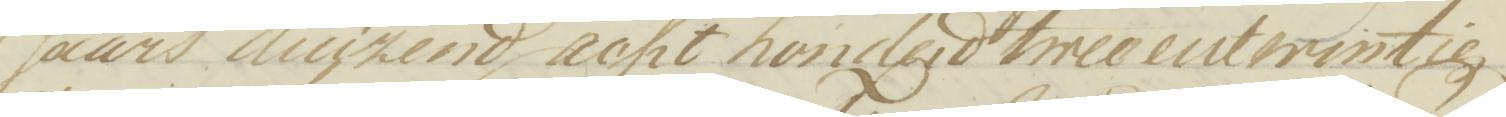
Jaars duizend acht honderd twee entwintig
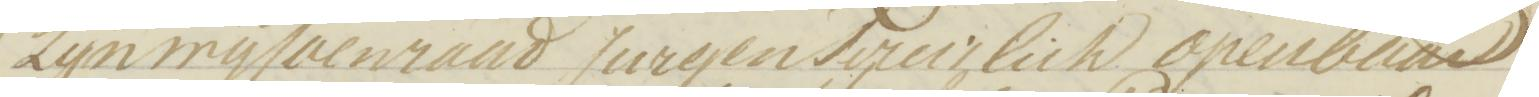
zijn wij Coenraad Jurgen Freitllich openbaar
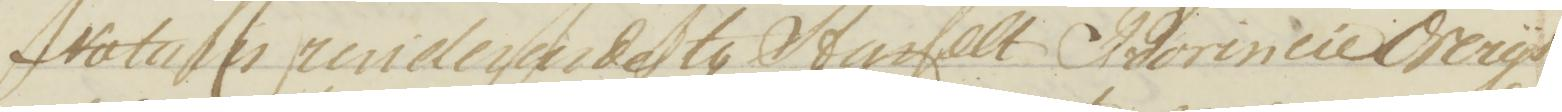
Notaris residerende te Hasselt Provincie Overijs
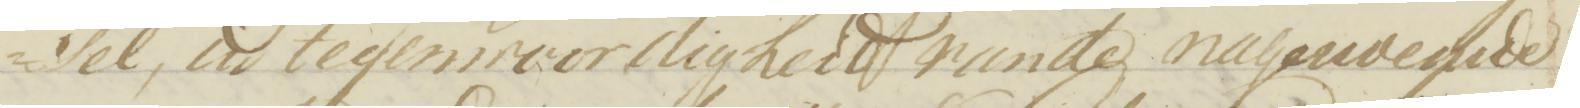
=sel, in tegenwoordigheid vande nagenoemde
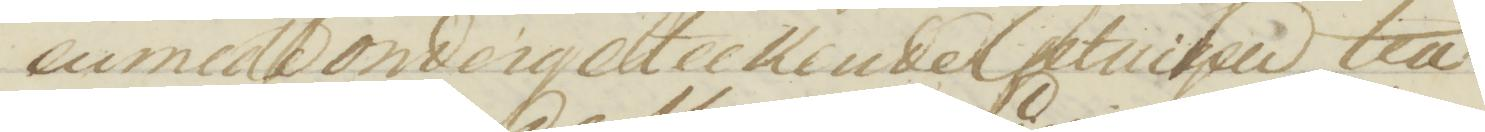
en mede ondergeteekende getuigen ten
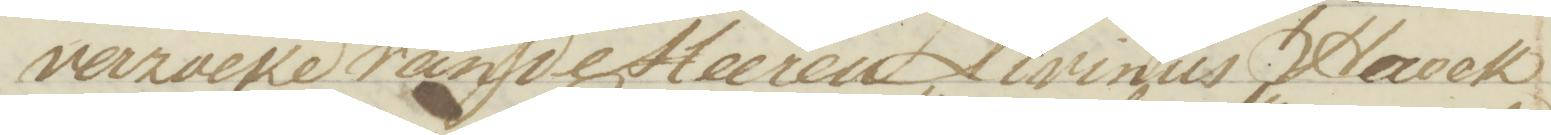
verzoeke van de Heeren Livinus Haeck
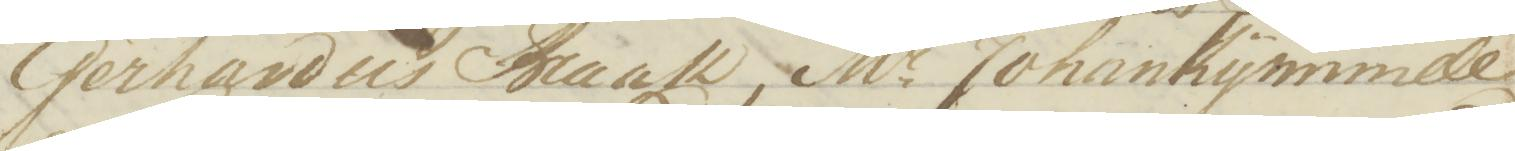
Gerhardus Braak, M:r Johan Kijmmell
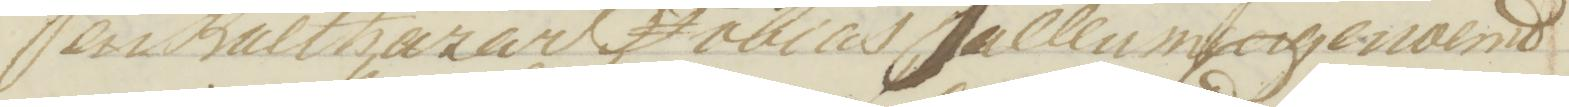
en Balthazar Tobias allen meergenoemd
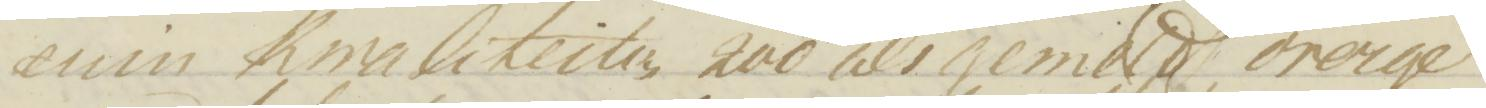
en in kwaliteiten zoo als gemeld overge
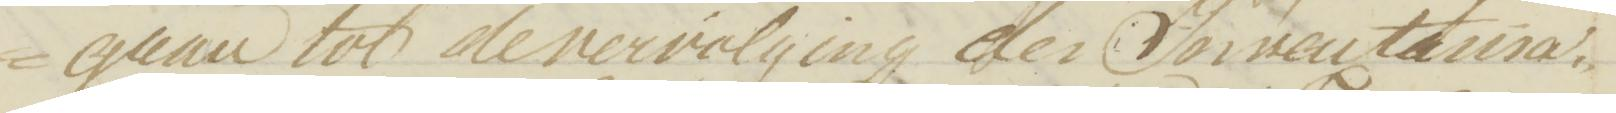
=gaan tot de vervolging der Inventarisa„
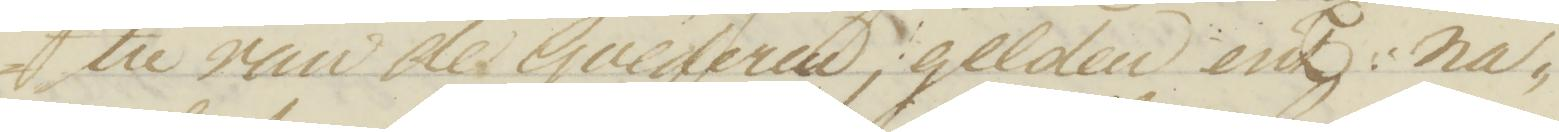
=tie van de Goederen, gelden enz: na„
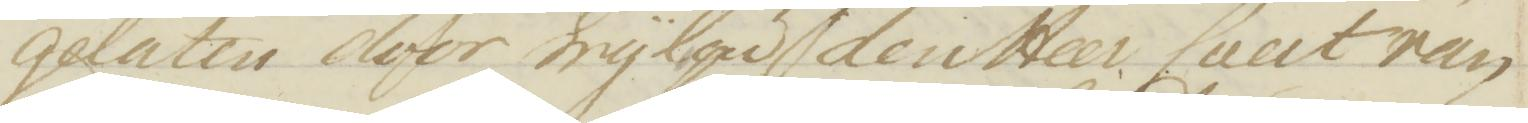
gelaten door wijlen den Heer Coert van
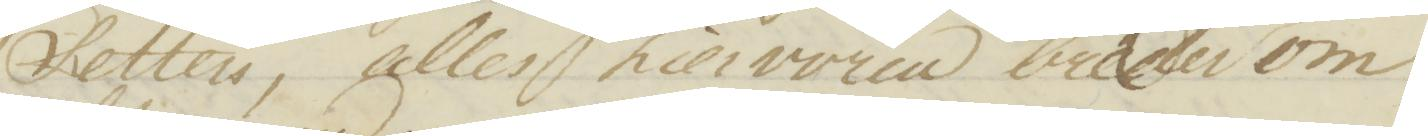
Setten, alles hiervoren breder om.
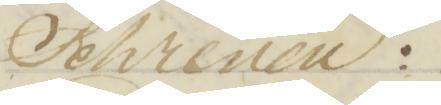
Schreven:
